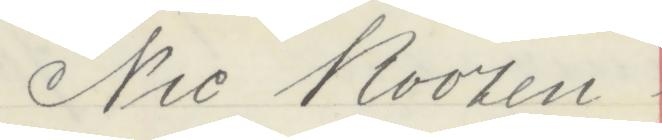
Nic Roozen
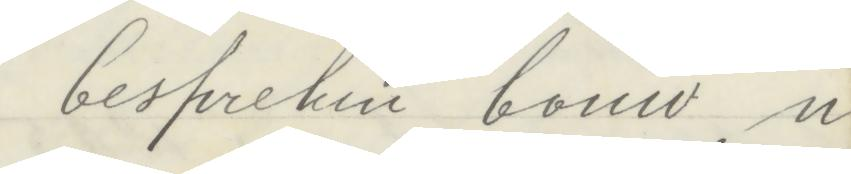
bespreken bouw u
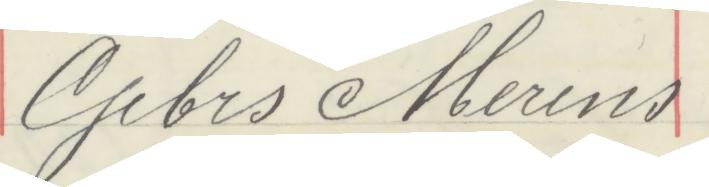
Gebrs Merens
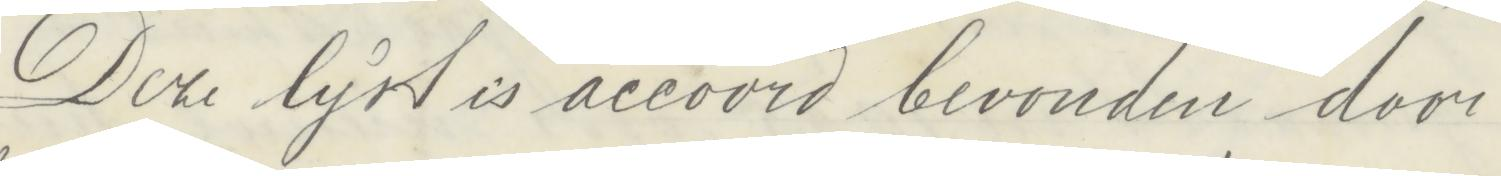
Deze lijst is accoord bevonden door
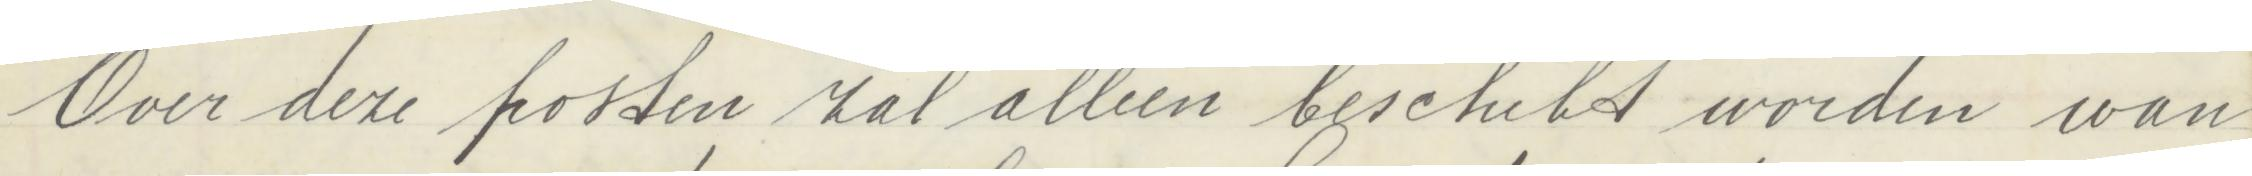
Over deze posten zal alleen beschikt worden wan
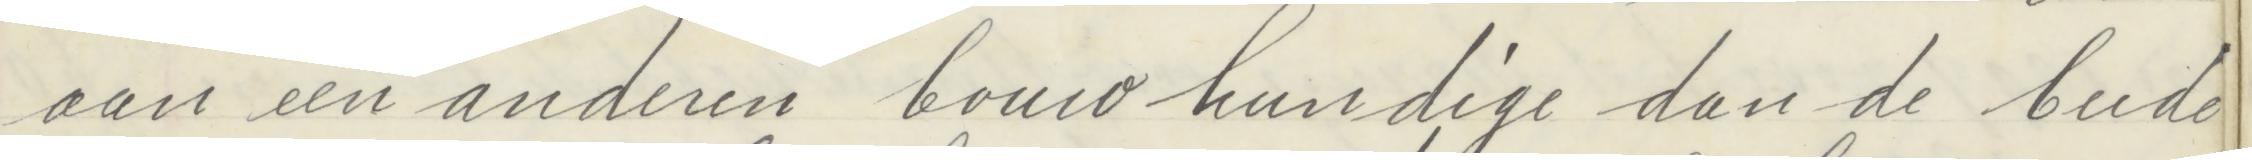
aan een anderen bouw kundige dan de beide
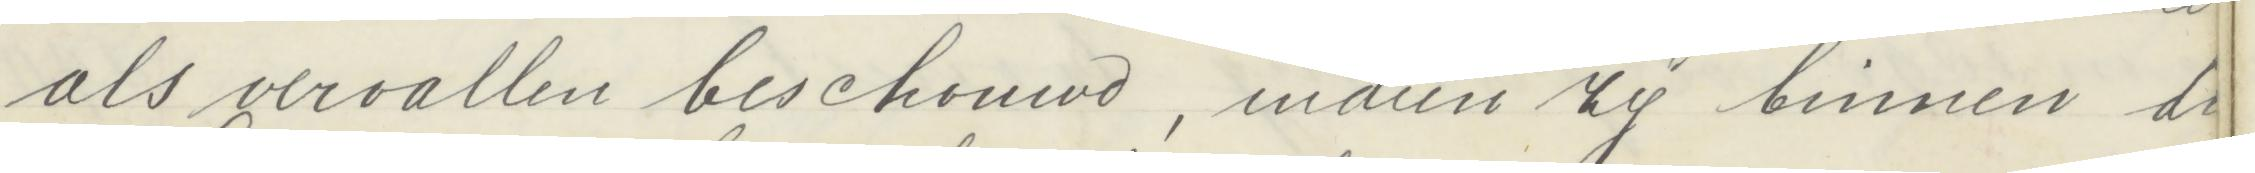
als vervallen beschouwd, indien zij binnen d
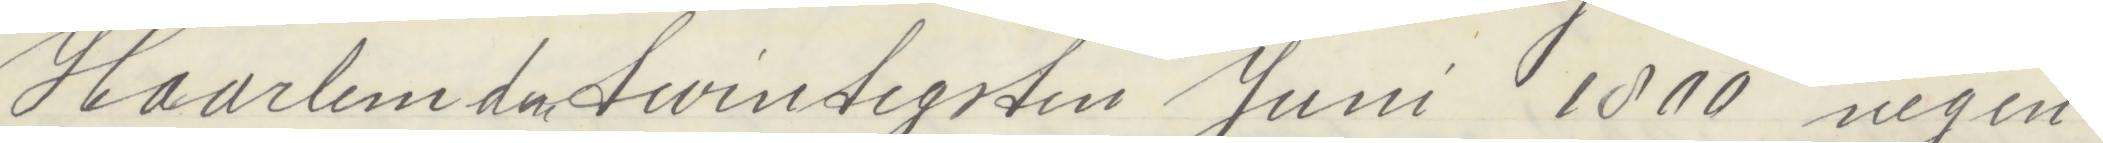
Haarlem den twintigsten Juni 1800 negen
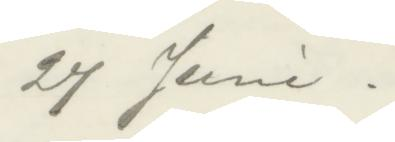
27 Juni.
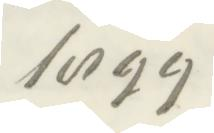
1899
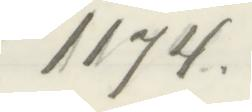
N=o 1174.
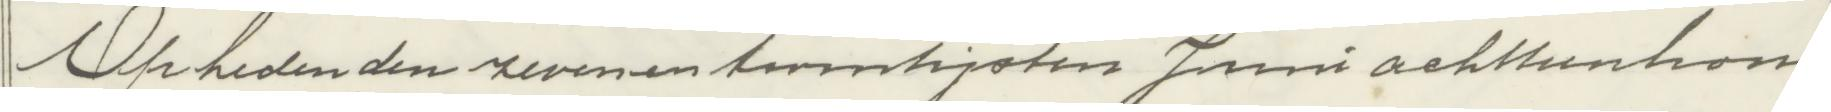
Op heden den zeven en twintigsten Juni achttienhon
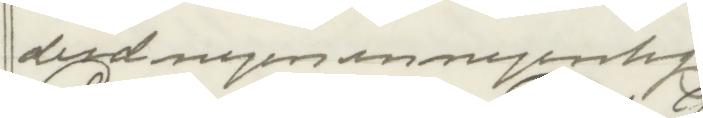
derd negen en negentig
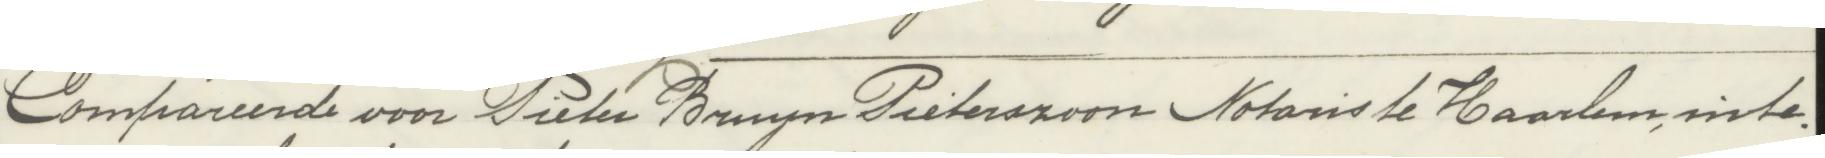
Compareerde voor Pieter Bruyn Pieterszoon Notaris te Haarlem, in te„
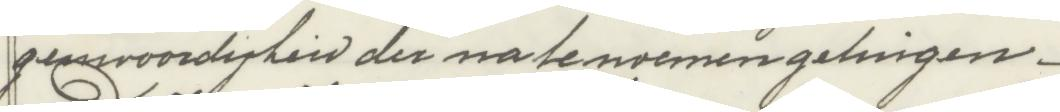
genwoordigheid der na te noemen getuigen.
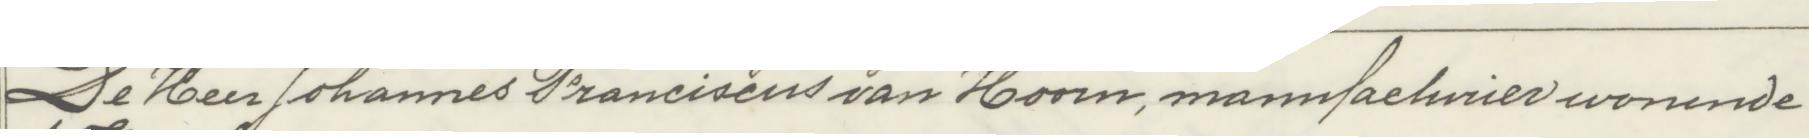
De Heer Johannes Franciscus van Hoorn, manufacturier wonende
